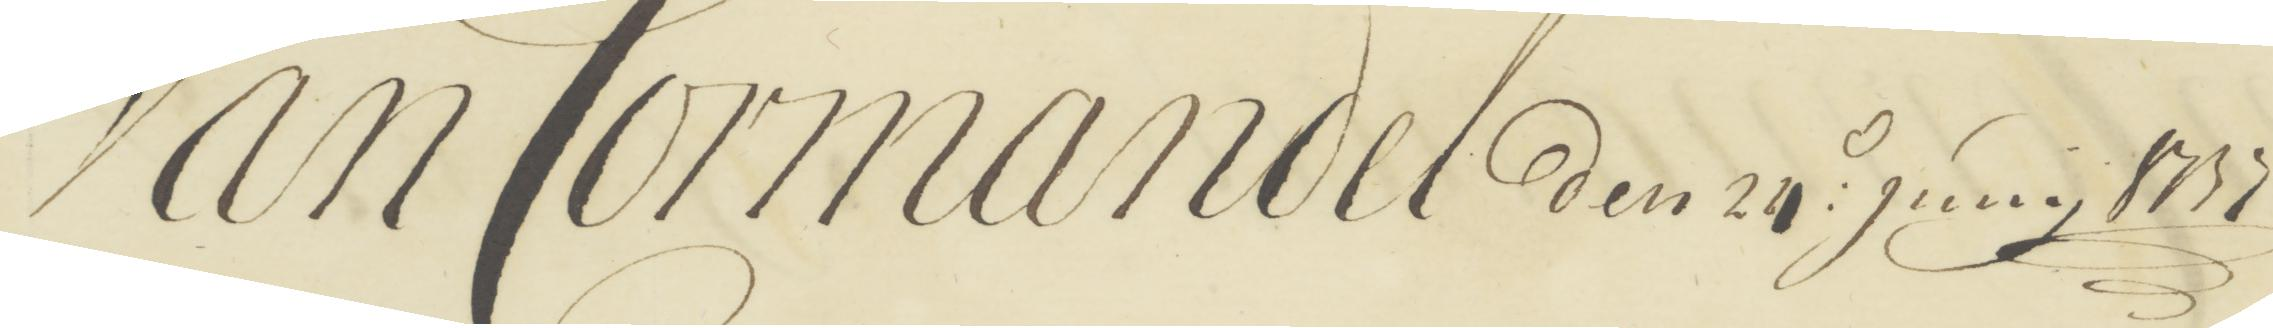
Van Cormandel den 24:' Junij 1737
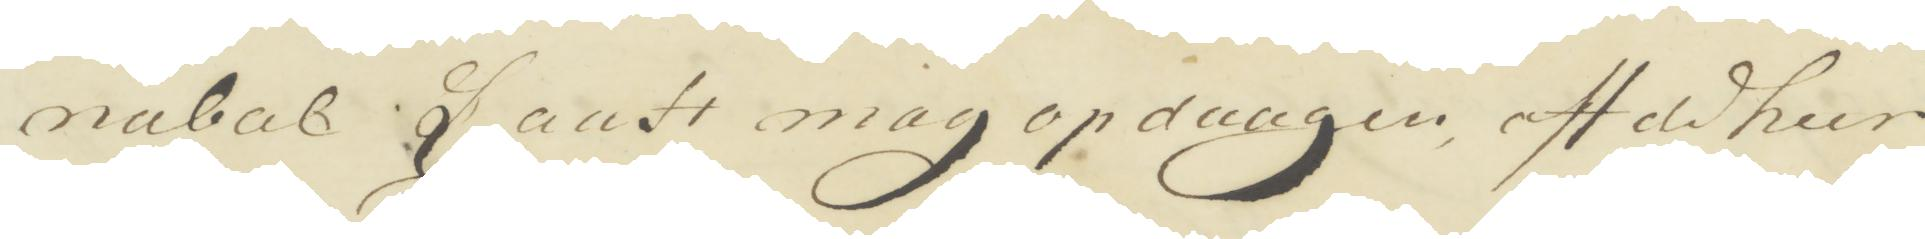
nabab laast mag op daagen, off de heer
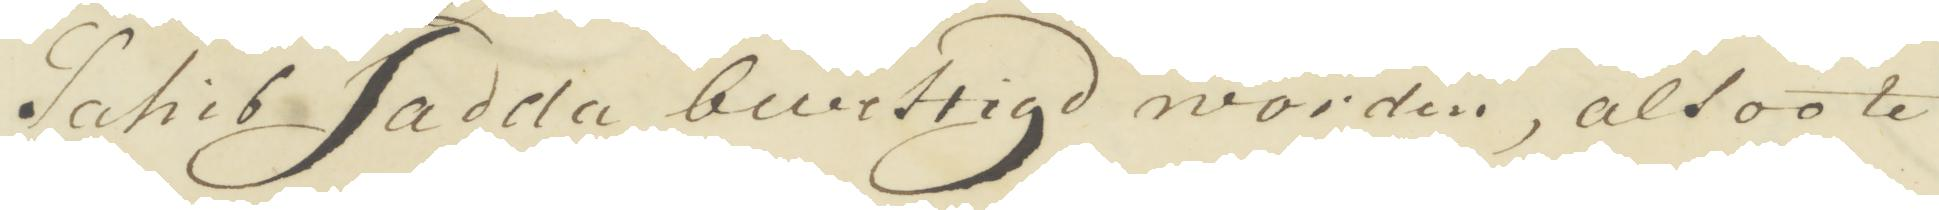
Sahis Jadda bevestigd worden, alsoo te
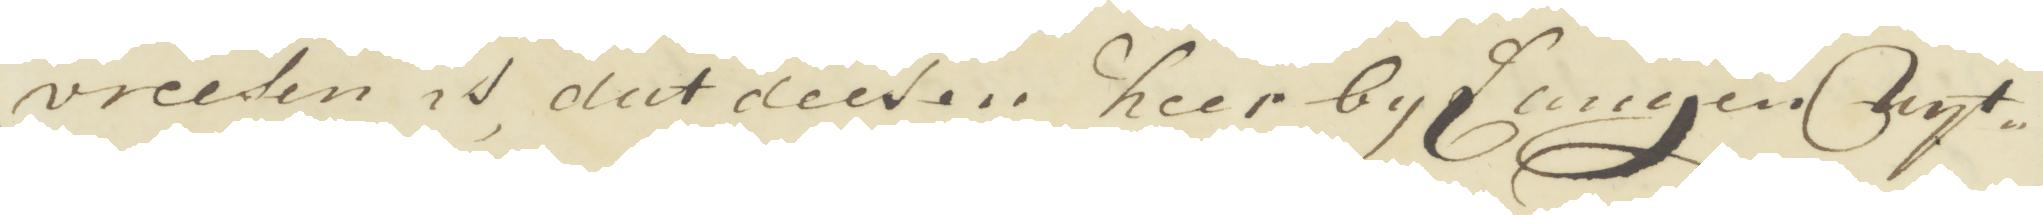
vreesen is, dat deesen heer bij langen uijt„
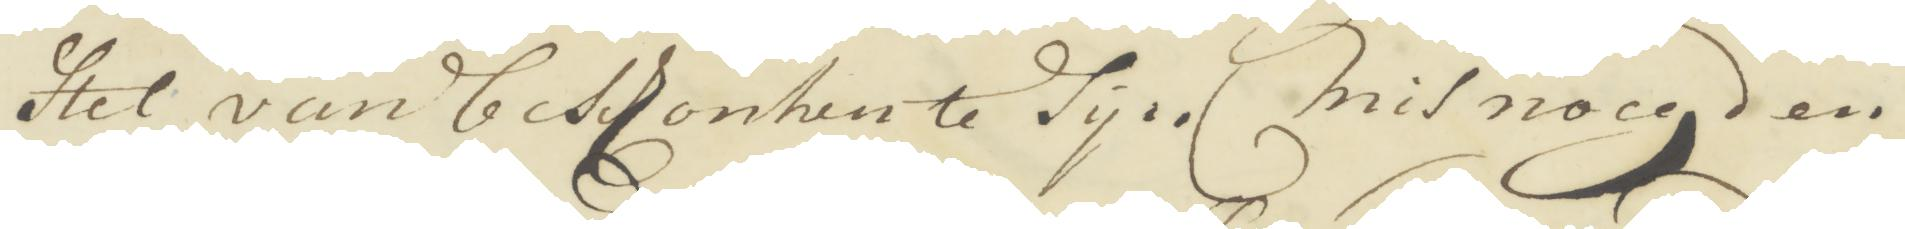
stel van beschonken te sijn misnoegd en
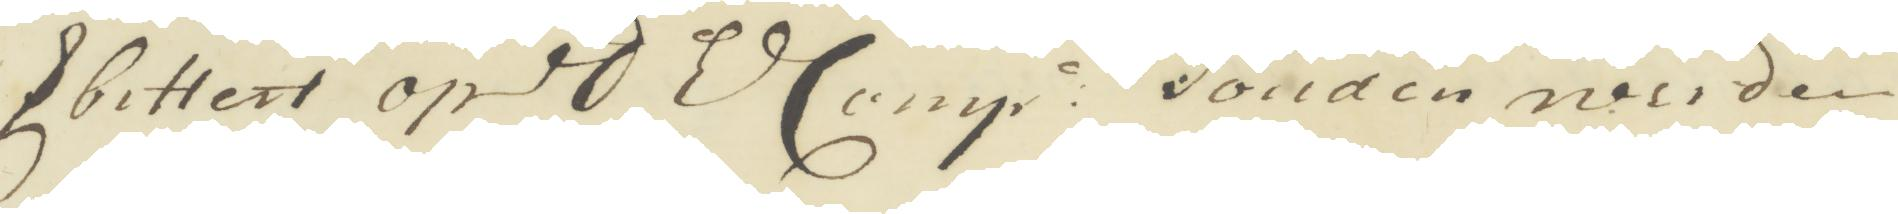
verbittert op d EComp:s souden werden
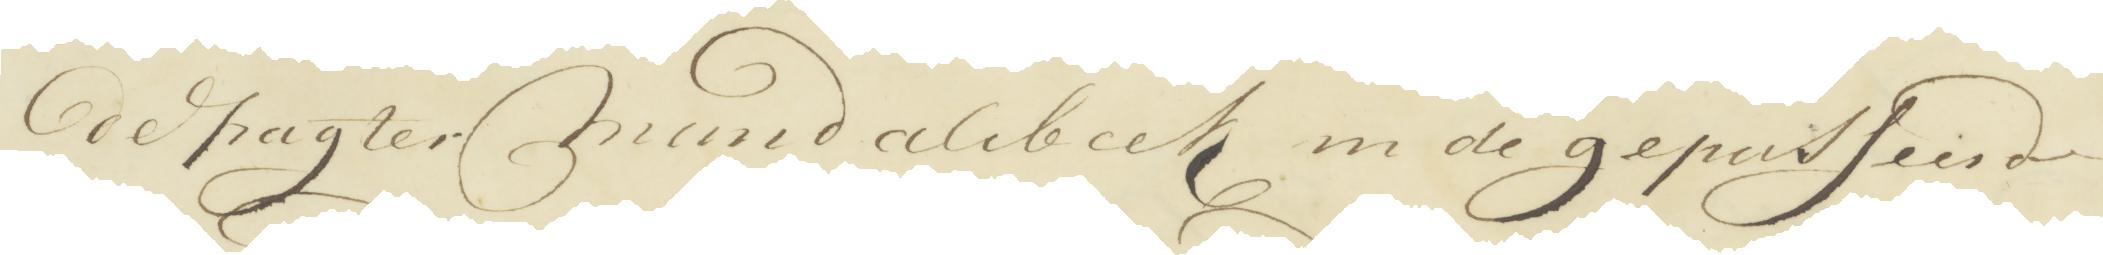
de pagter mandakbeek in de gepasseerde
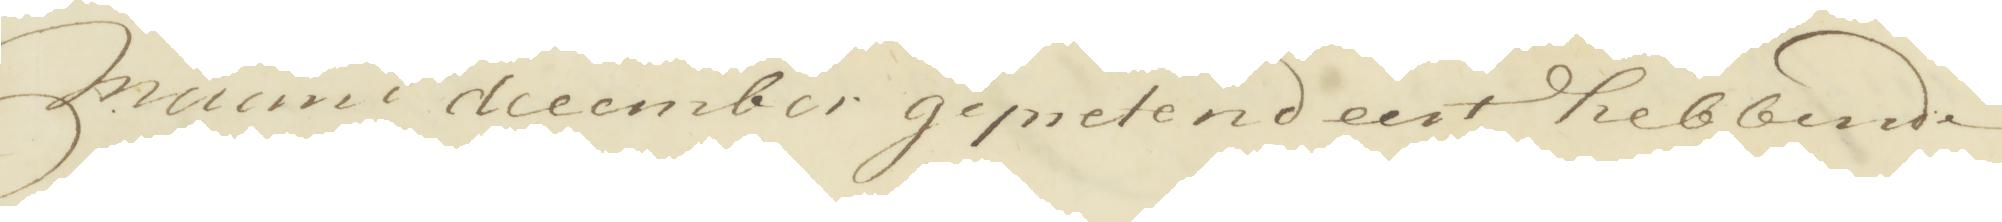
maand december gepretendeert hebbende
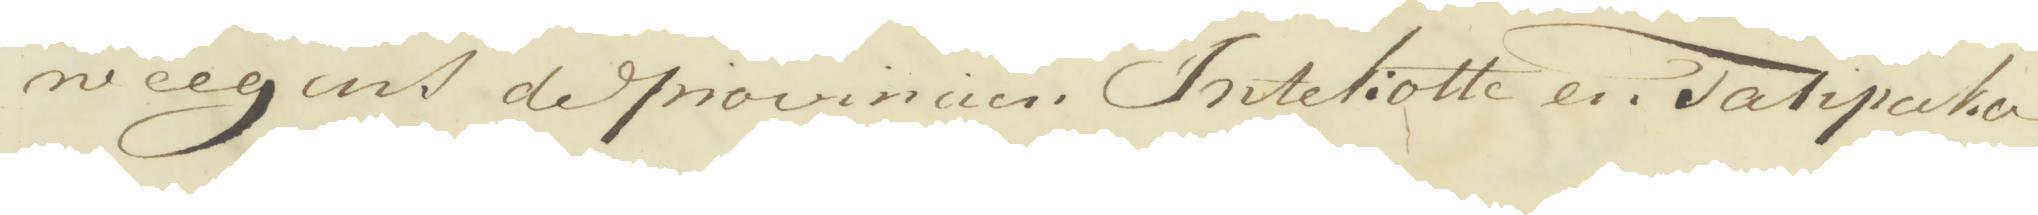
weegens de provincien Intekotte en Tatipaka
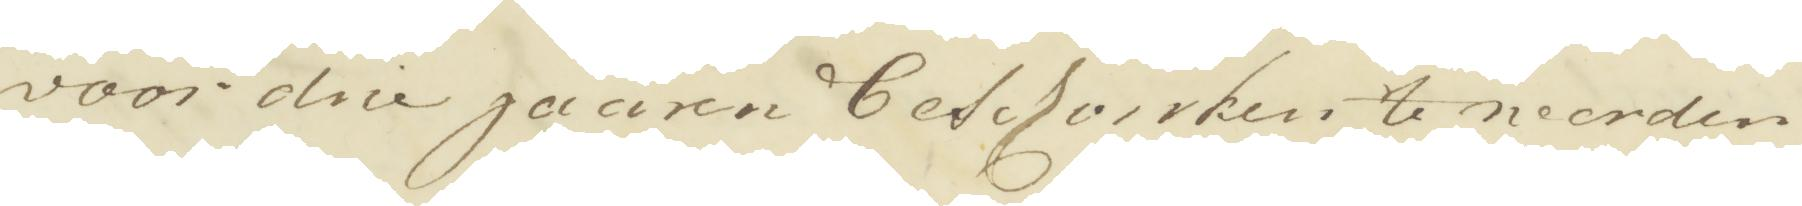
voor drie Jaaren beschonken te werden
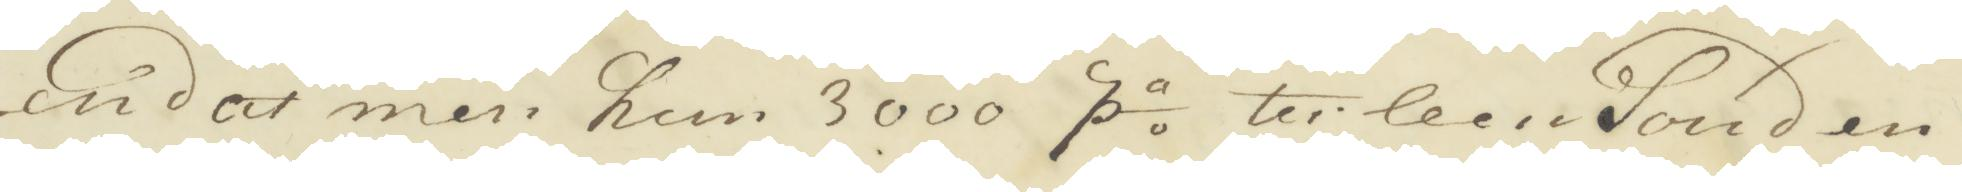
en dat men hem 3000 pa/o ter leen souden
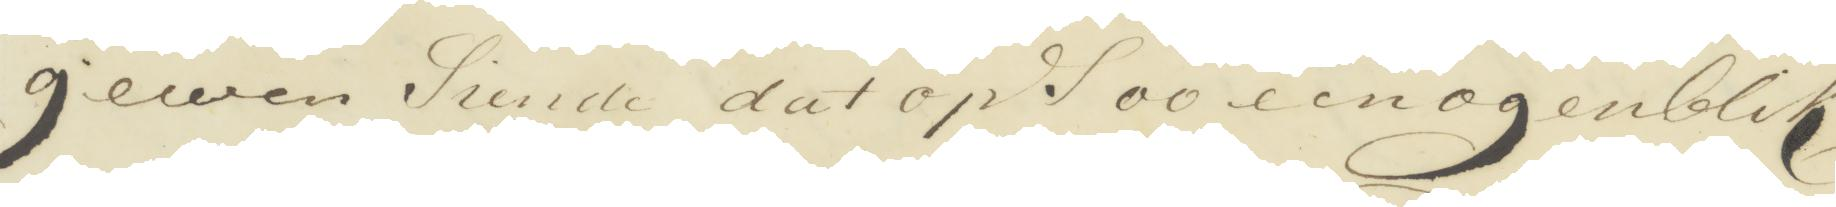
geeven siende dat op soo een ogenblik
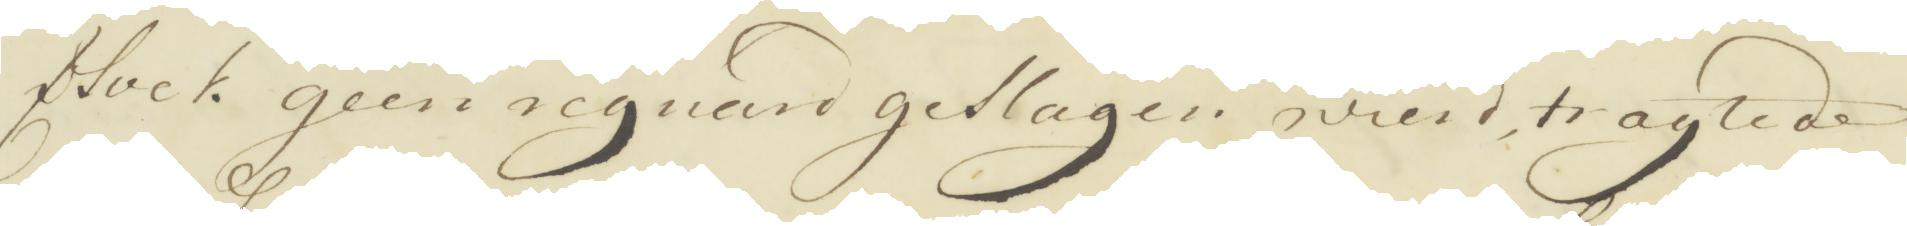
versoek geen reguard geslagen wierd, tragte de
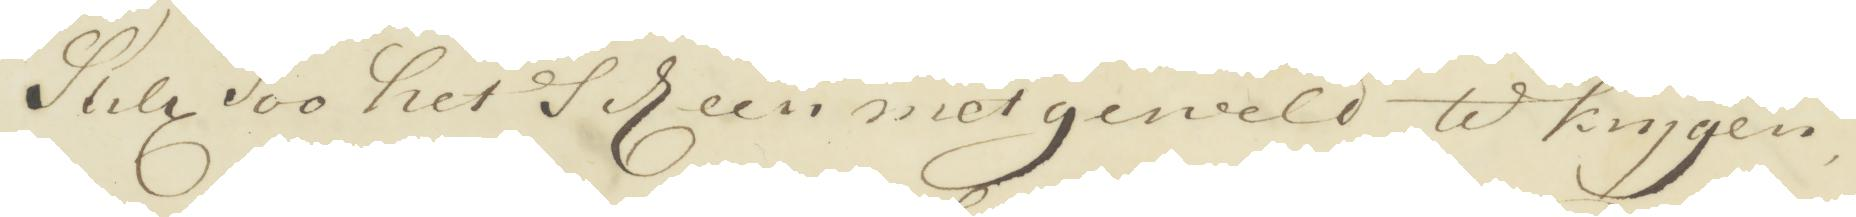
sulx soo het scheen met geweld te krijgen,
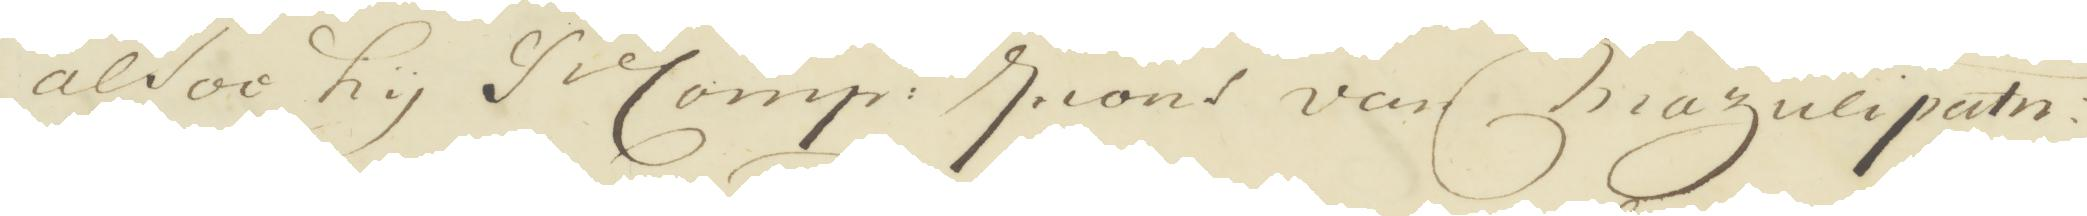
alsoo hij 's Comp:s pions van mazulipatn
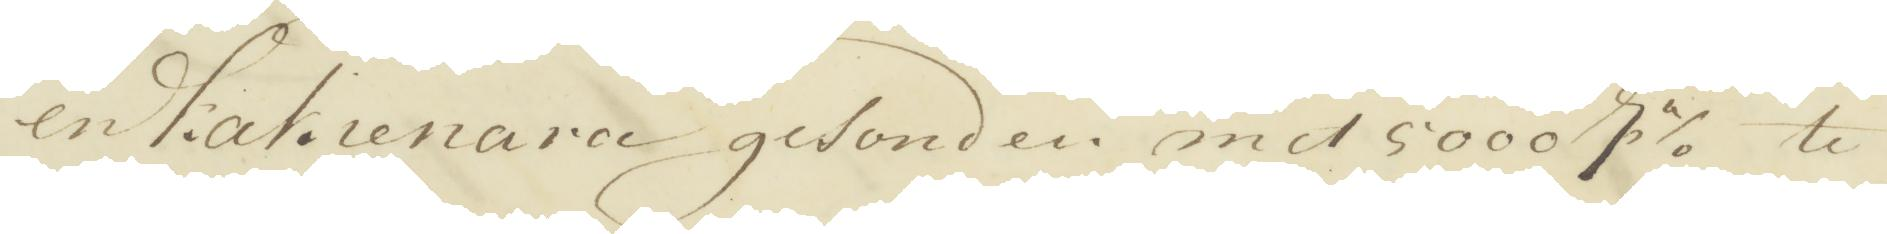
en kakienara gesonden met 5000 pa/o te
